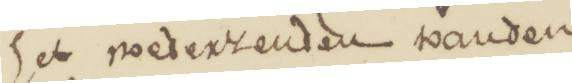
het wederzenden vanden
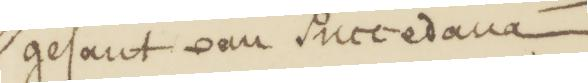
gesant van succedana
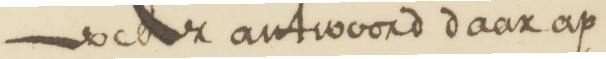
weder antwoord daar ap
